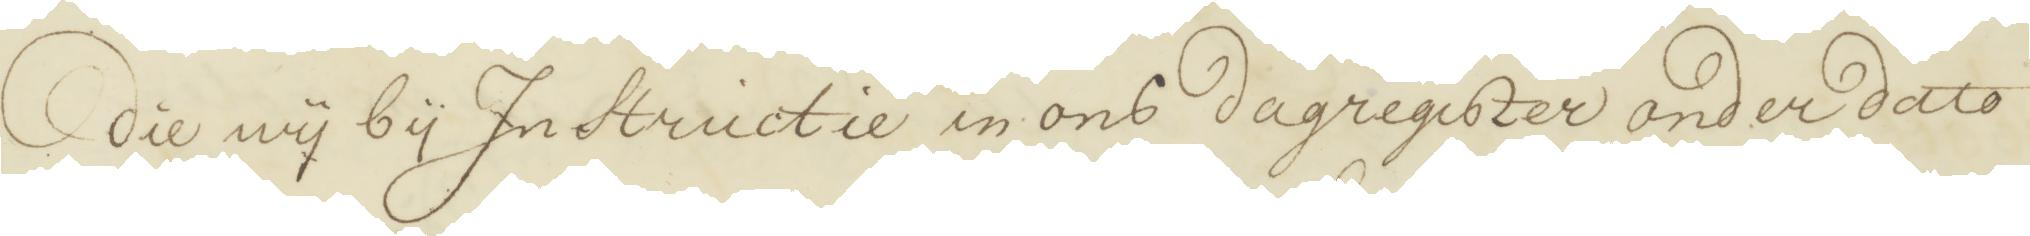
die wij bij Jnstructie in ons dagregister onder dato
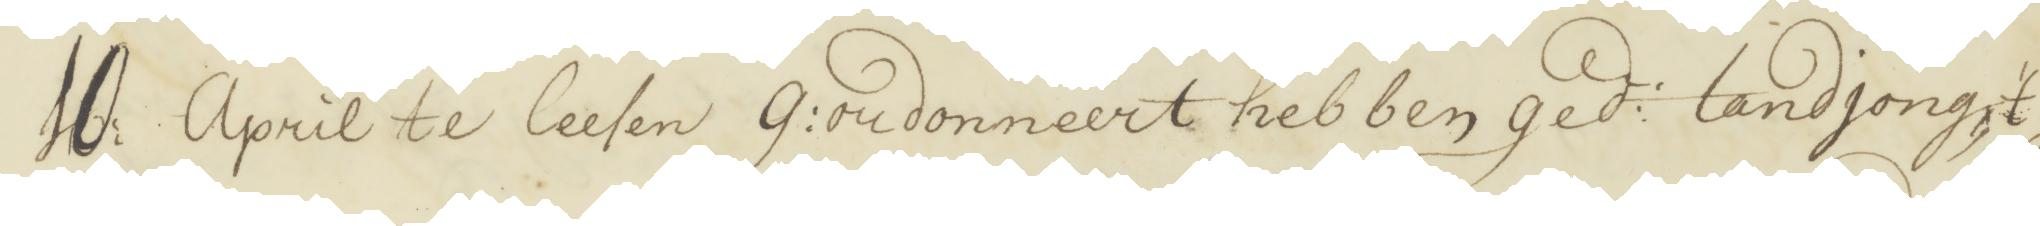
10: April te leesen g:ondonneert hebben ged: tandjong„
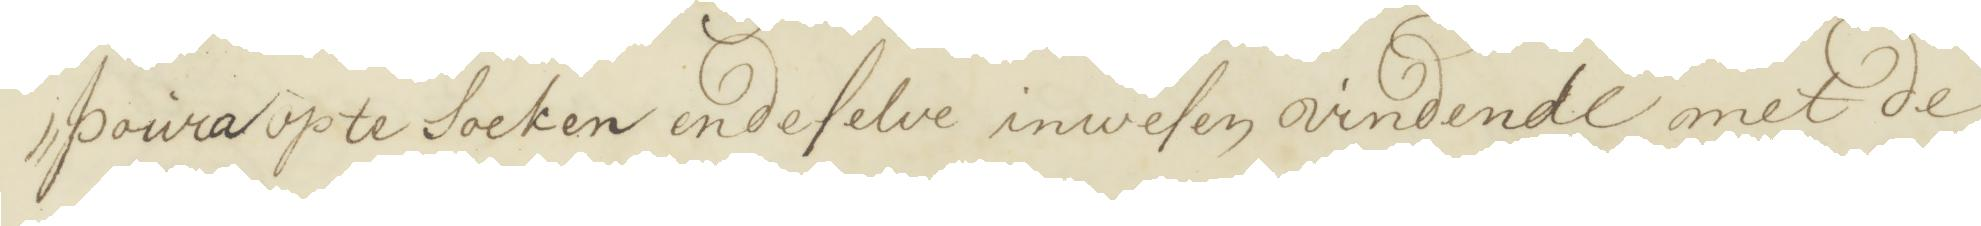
„poura op te soeken en deselve inwesen vindende met de
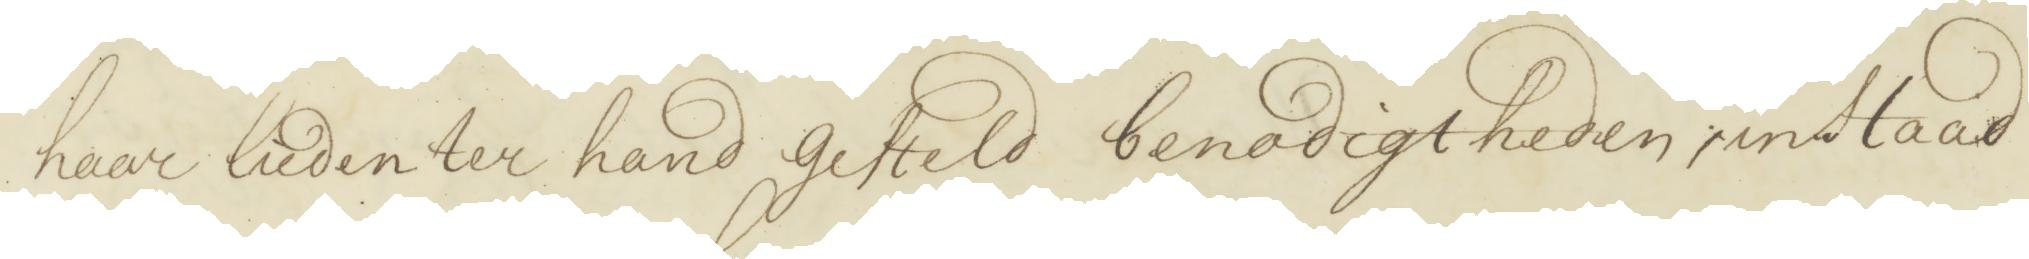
haar lieden ter hand gesteld benodigtheden, instaad
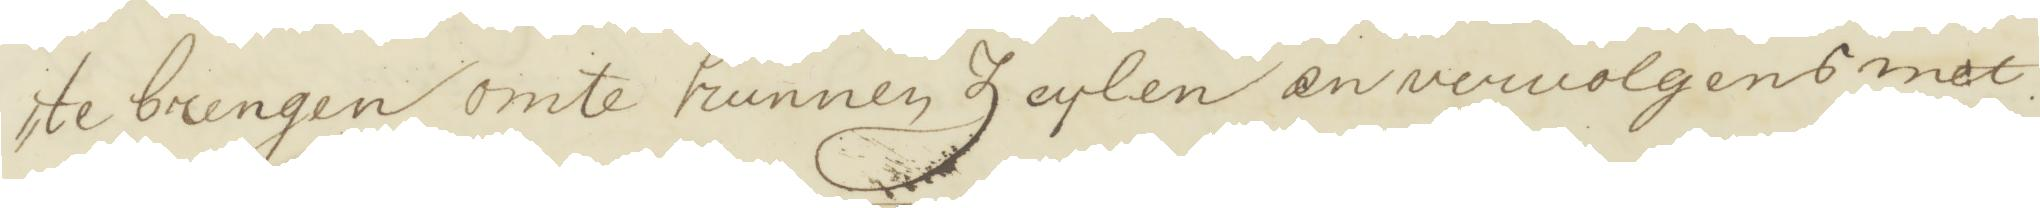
„te brengen omte kunnen Zeylen en vervolgens met
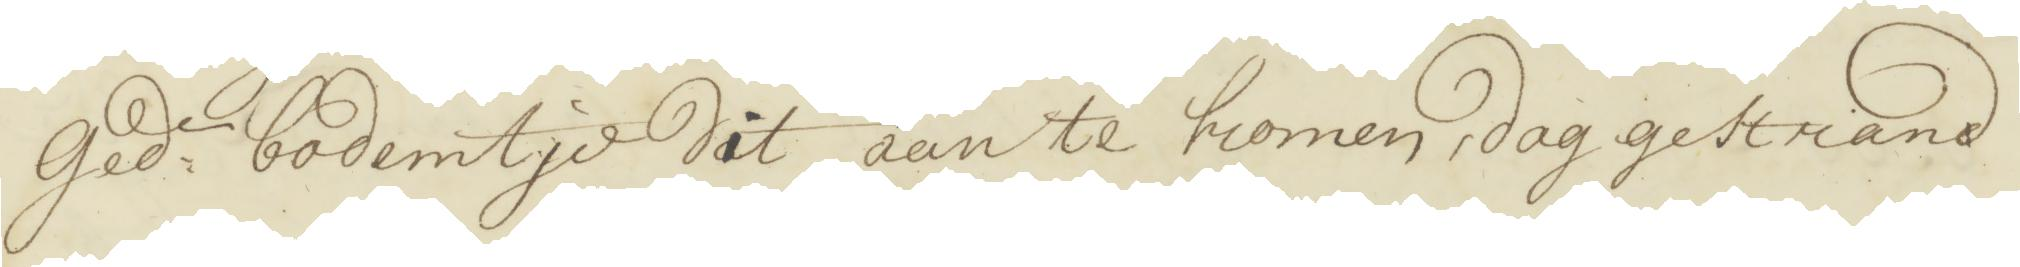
Ged:e bodemtje dit aan te komen, dag gestrand
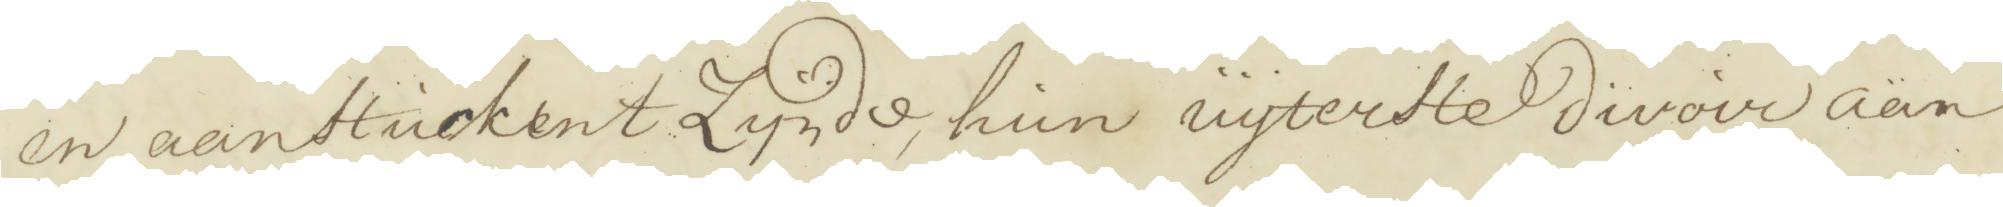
en aanstuckent zijnde, hun uijterste divoir aan
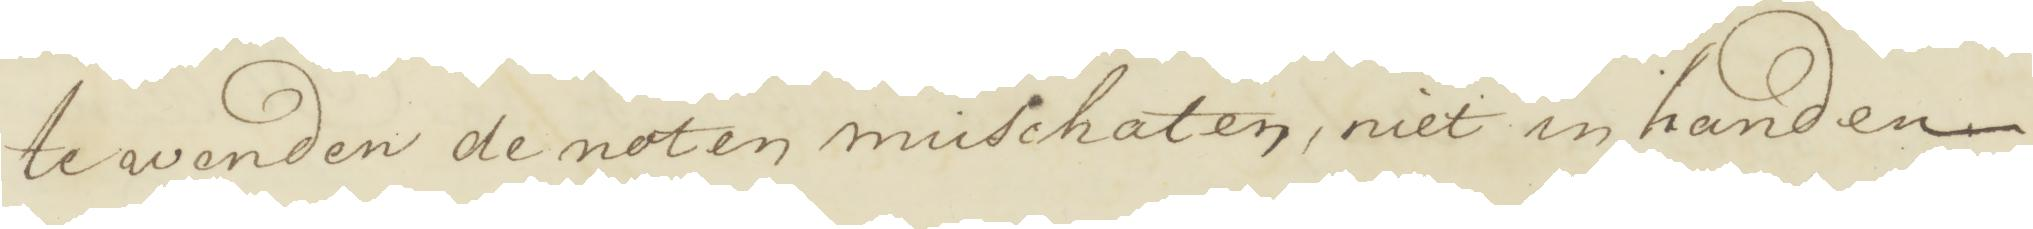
te wenden de noten muschaten, niet in handen
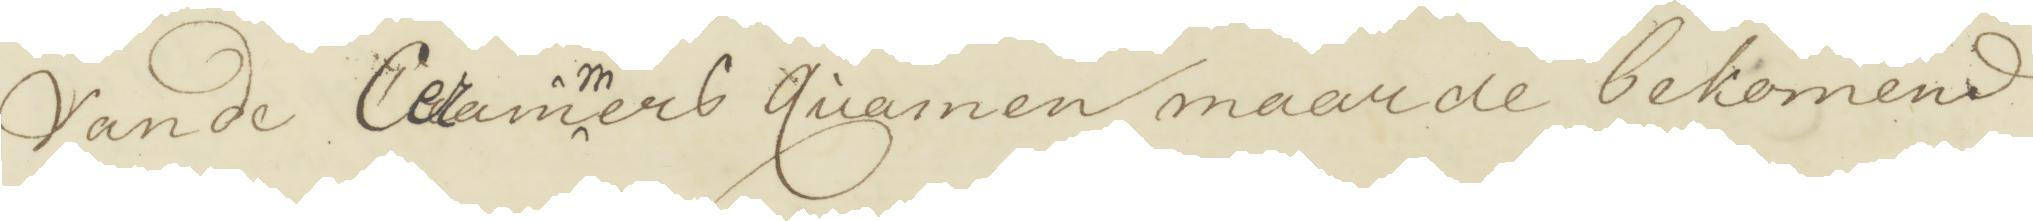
Van de Cerammers quamen maarde bekomend
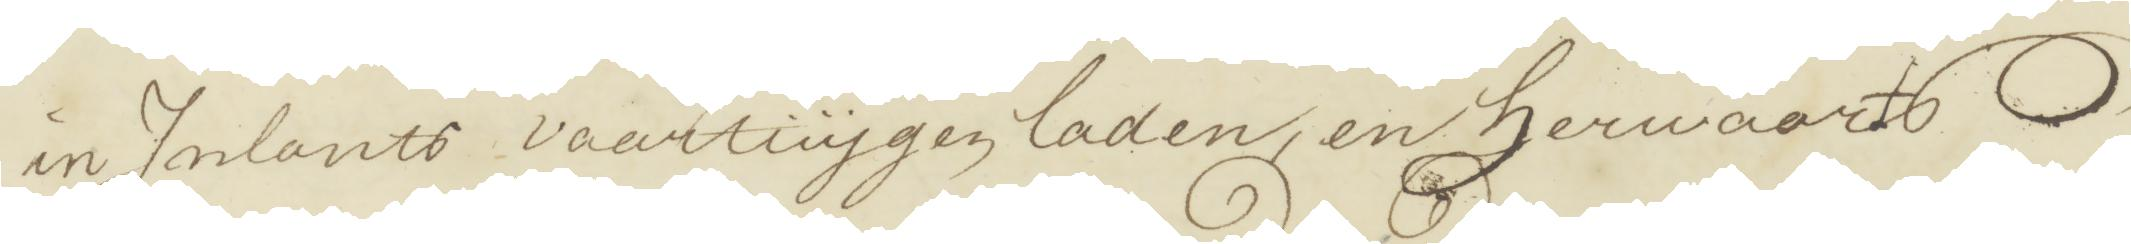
in Jnlants vaartuijgen laden, en herwaarts
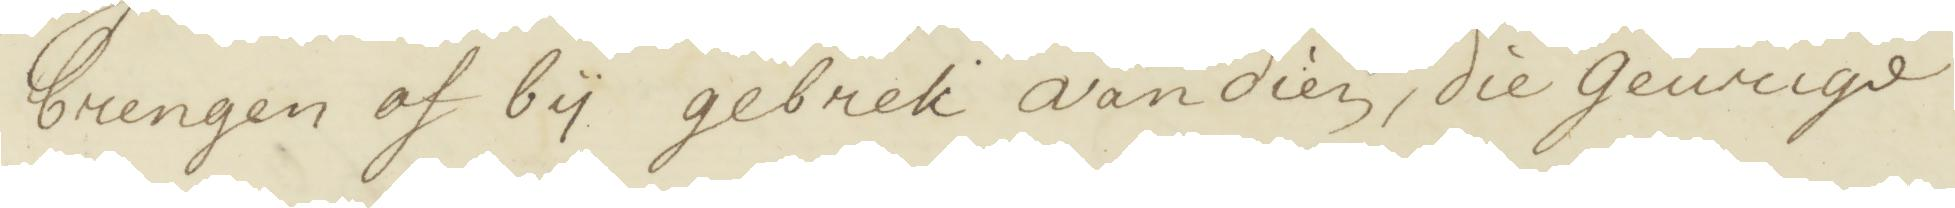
brengen of bij gebrek van dien, die Geurige
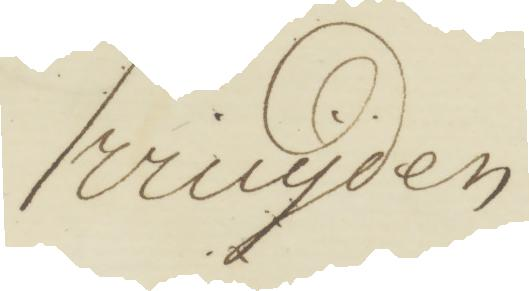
kruijden
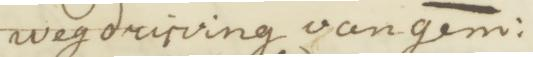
wegdrijving van gem:
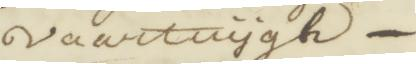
vaartuijgh —
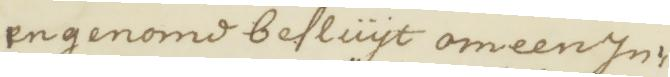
en genome besluijt om een Jn„
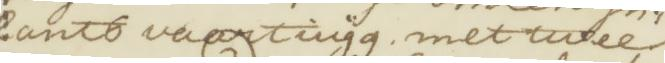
lants vaartuijg, met twee
